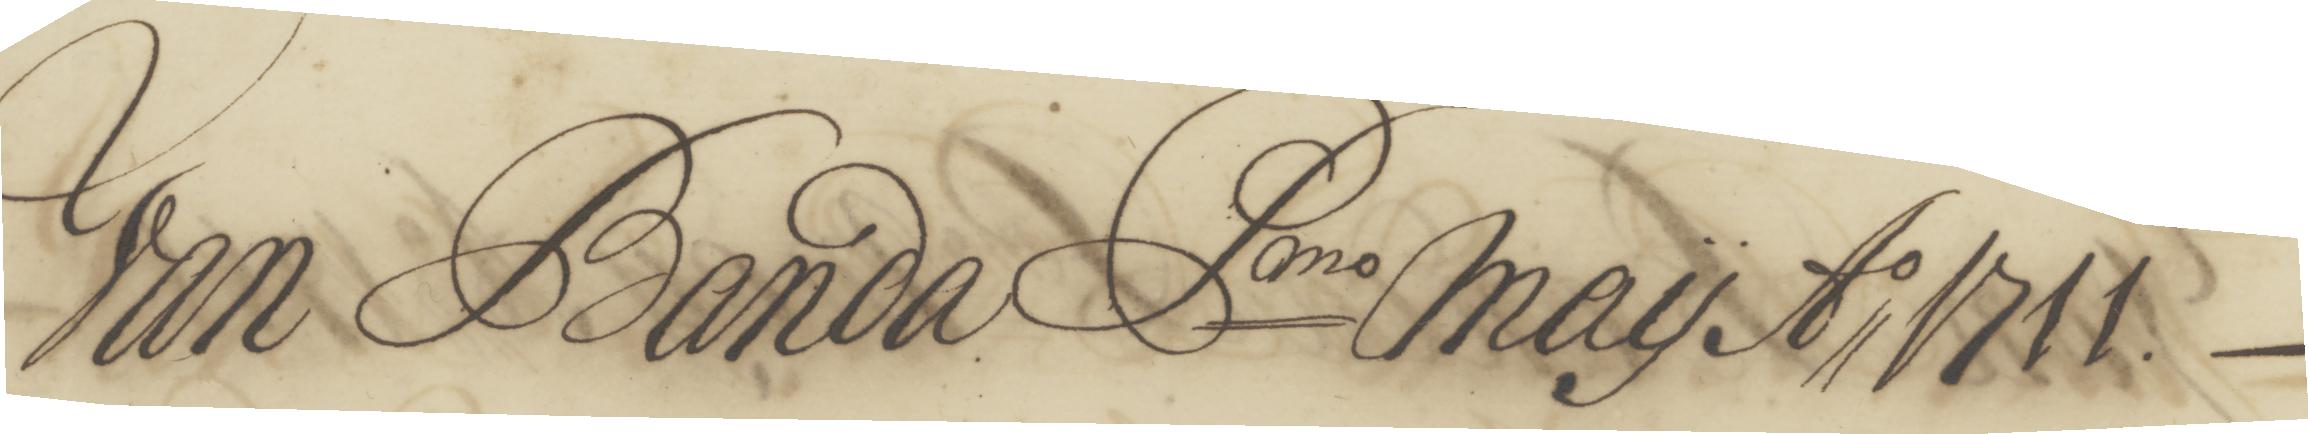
Van Banda P=mo Maij A„o 1711. —
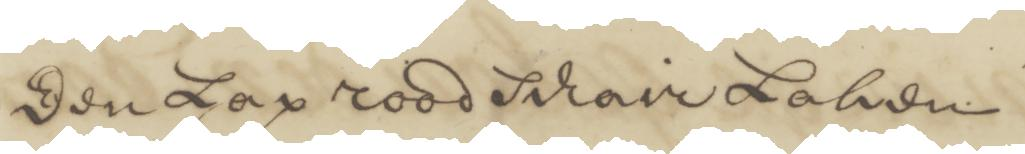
Een Lap rood schair Laken
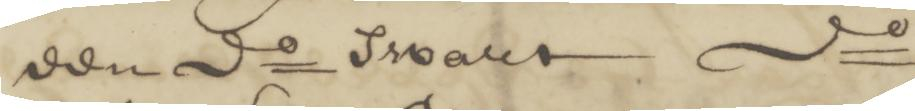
een d=o swart d=o
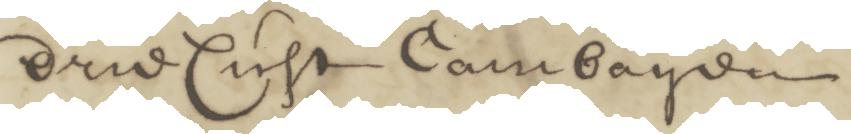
drie Cust Cambaijen
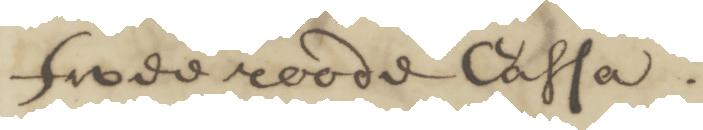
twee roode Cassa -
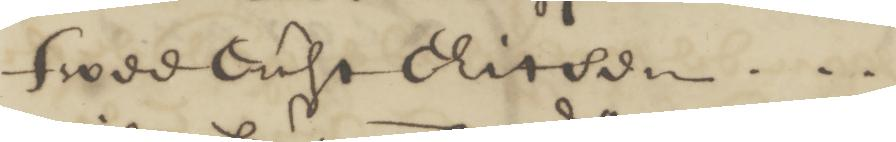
twee Cust Chitsen - - -
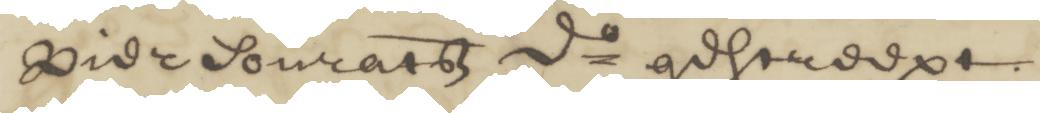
vier souratsz d=o gestreept.
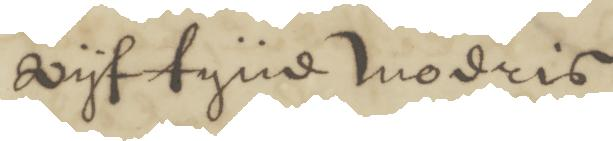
vijf fijne moeris
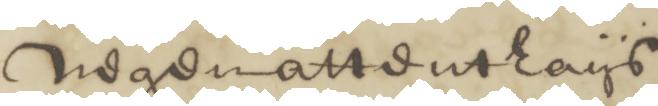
Negen attenthaijs
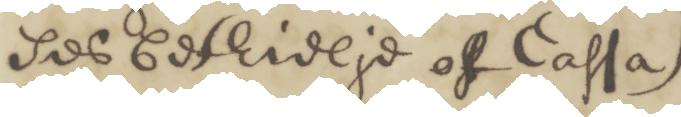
ses bethielje of Cassa
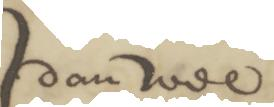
} dan Wel
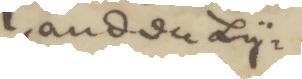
} ander Lij„
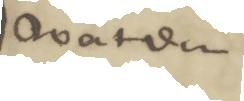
waten
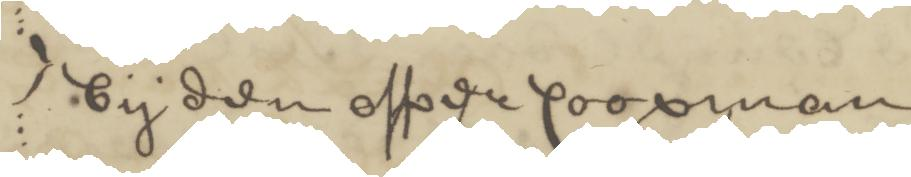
} bij den oppercoopman
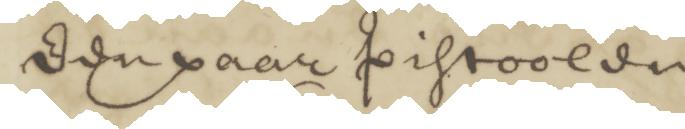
Een paar pistoolen
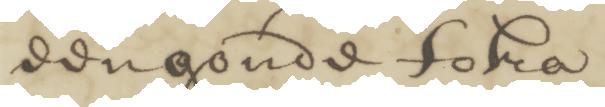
een goude toka
